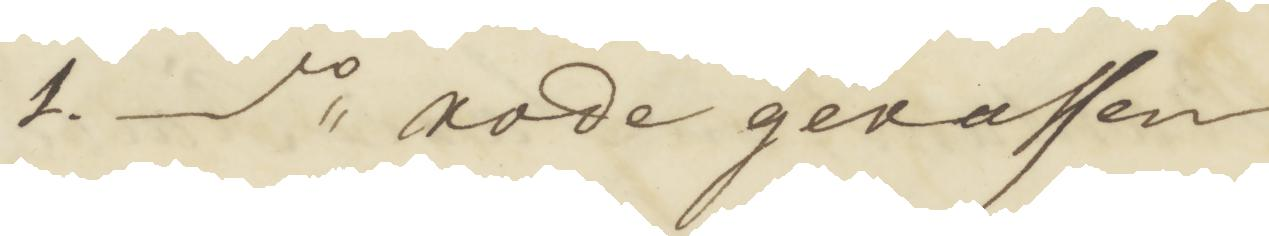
1. _„o rode gerassen
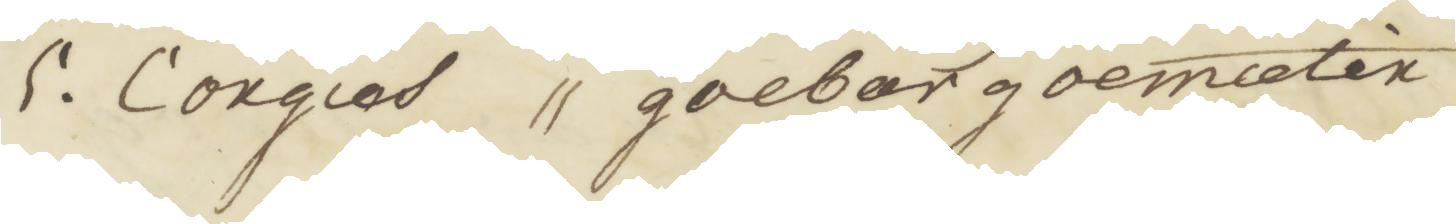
5. Corgies „ goebar goemietir
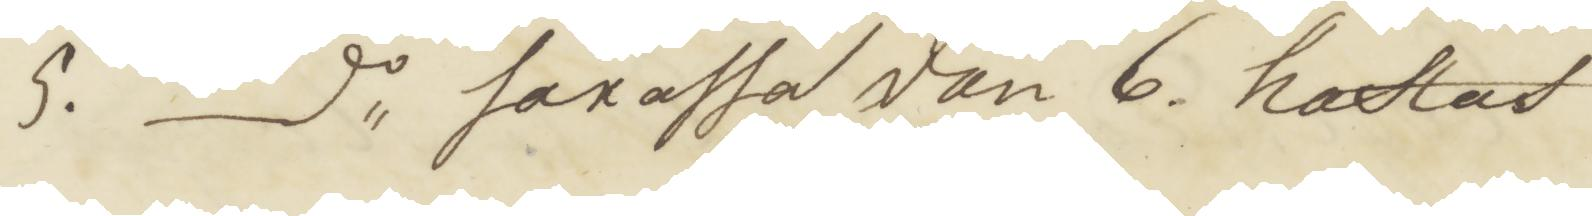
5. _„o sarassa van 6. hastas
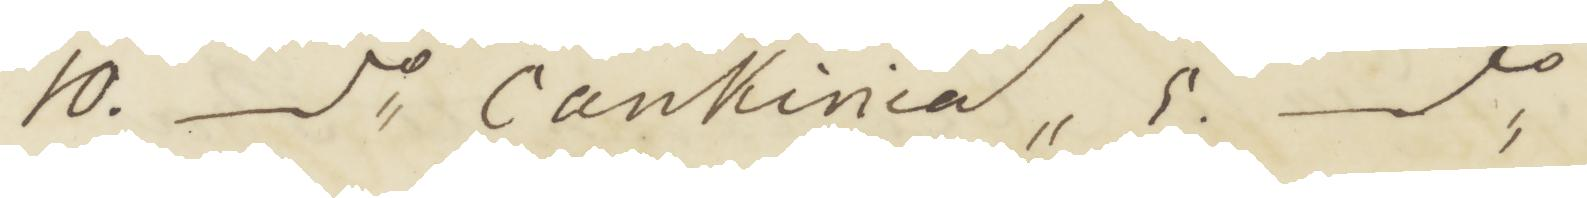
10. _„o cankinia „ 5. _„o
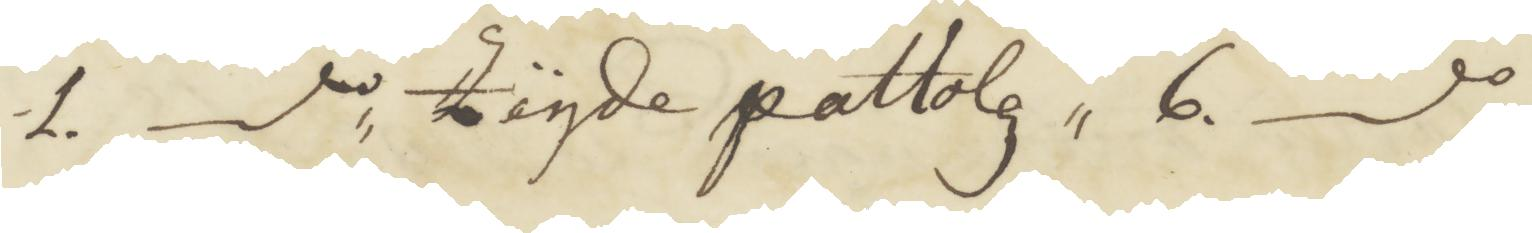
1. _„o Zeijde pattolen „ 6. _„o
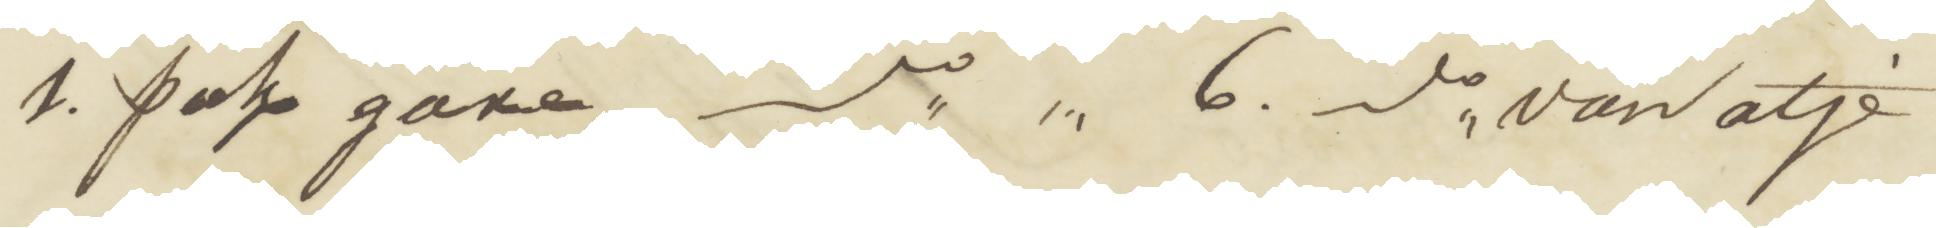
1. pak gare _„o „, 6. _„o van atje
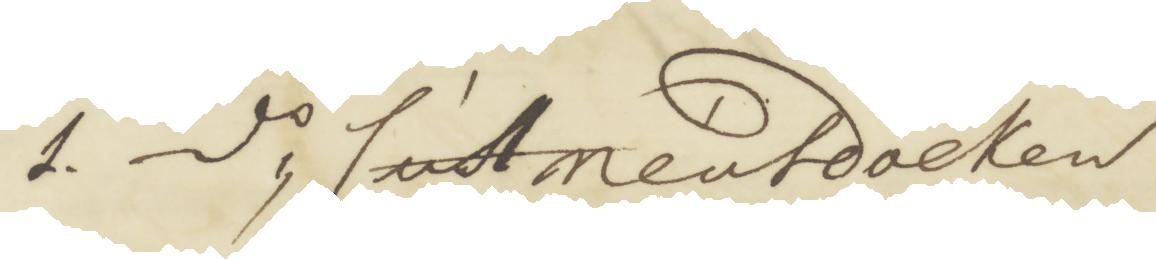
1. _„o custneusdoeken
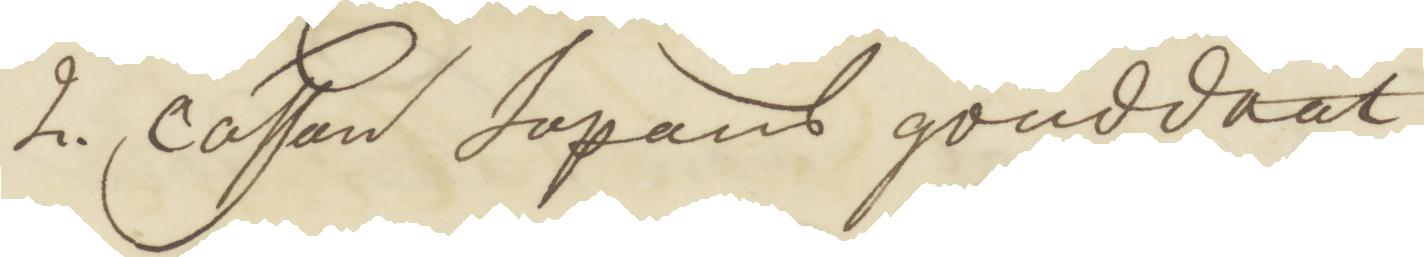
2. cassan Japans gouddaat
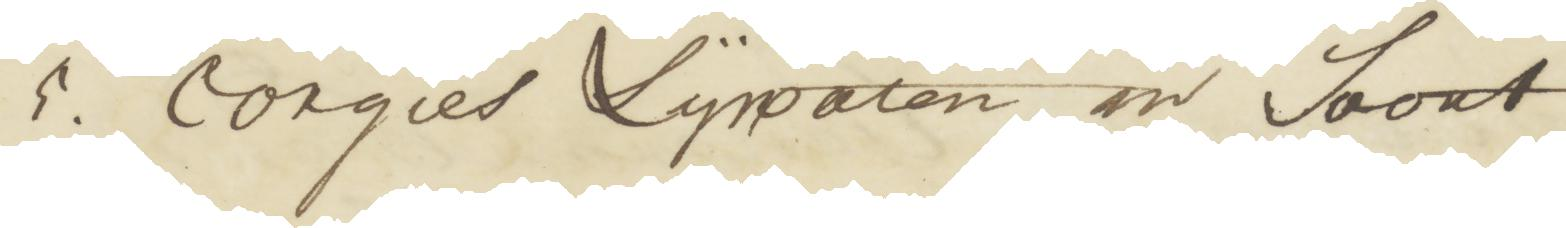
5. corgies lijwaten in soort
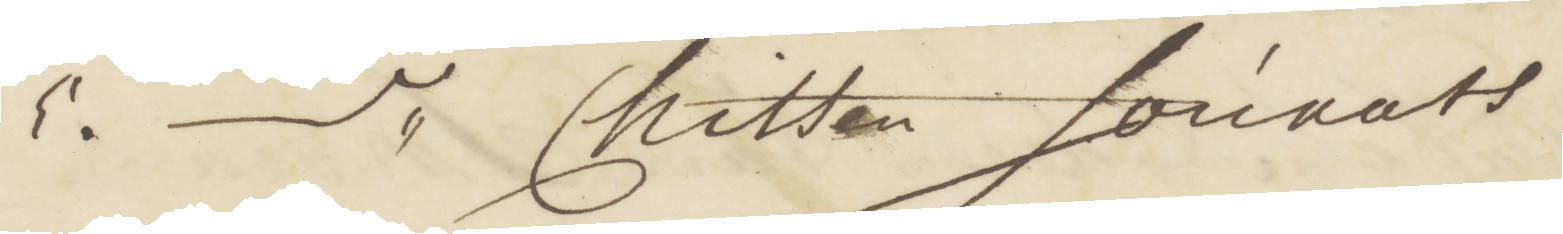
5. _„o Chitsen Sourats
